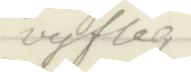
vyfteg
